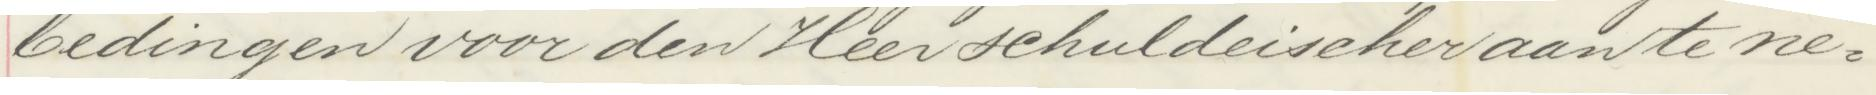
bedingen voor den Heer schuldeischer aan te ne=
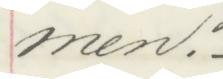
men.
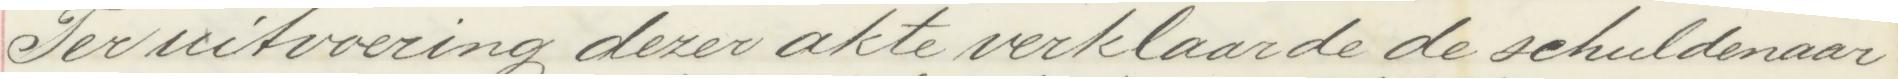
Ter uitvoering dezer akte verklaarde de schuldenaar
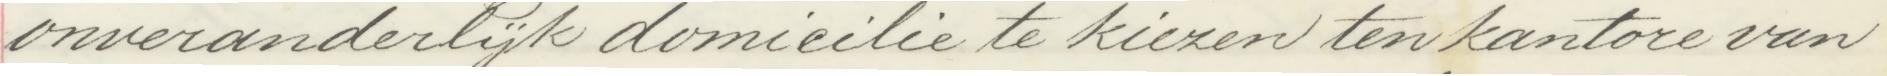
onveranderlijk domicilie te kiezen ten kantore van
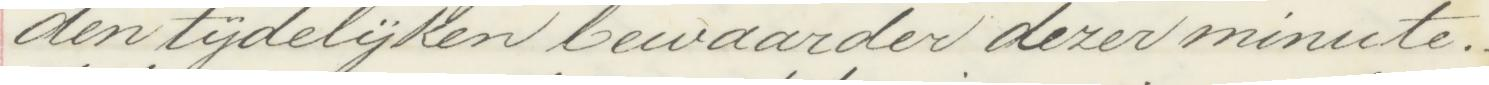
den tijdelijken bewaarder dezer minute.
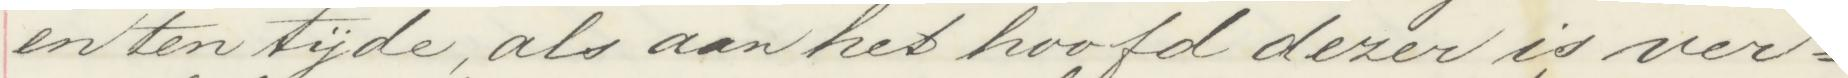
en ten tijde, als aan het hoofd dezer is ver=
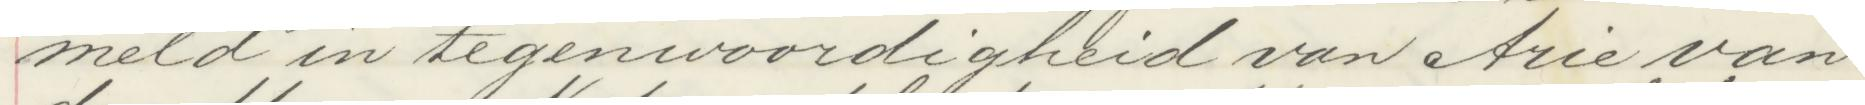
meld in tegenwoordigheid van Arie van
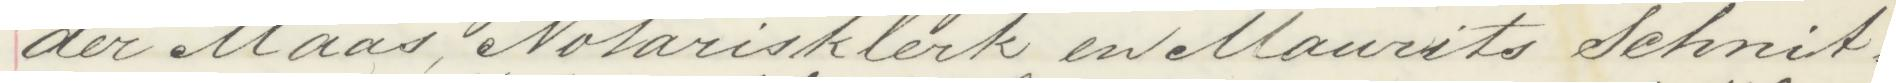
der Maas, Notarisklerk en Maurits Schnit=
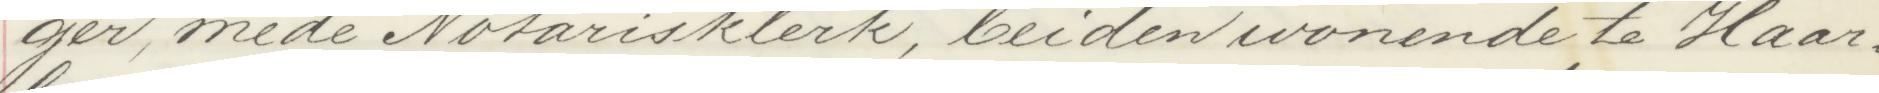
ger, mede Notarisklerk, beiden wonende te Haar
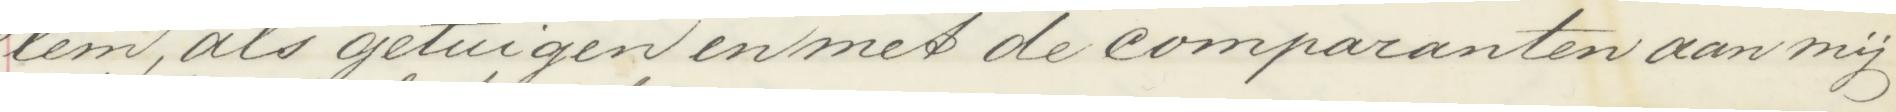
lem, als getuigen en met de comparanten aan mij
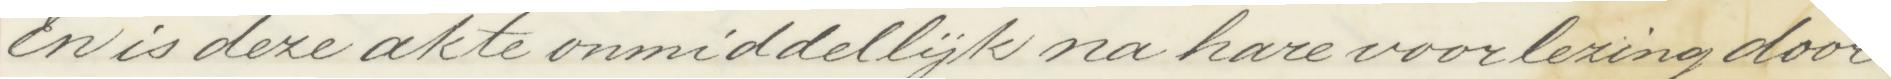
En is deze akte onmiddellijk na hare voorlezing door
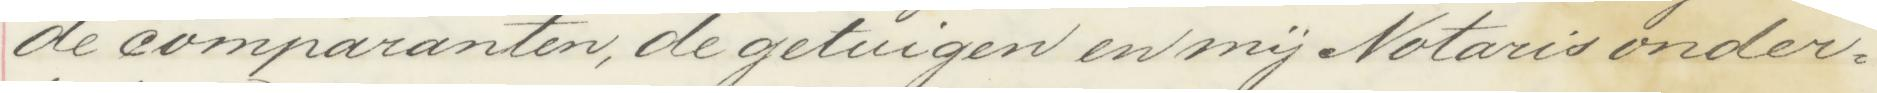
de comparanten, de getuigen en mij Notaris onder=
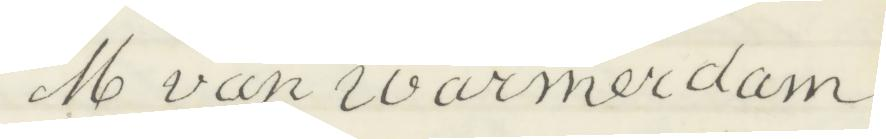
M van Warmerdam
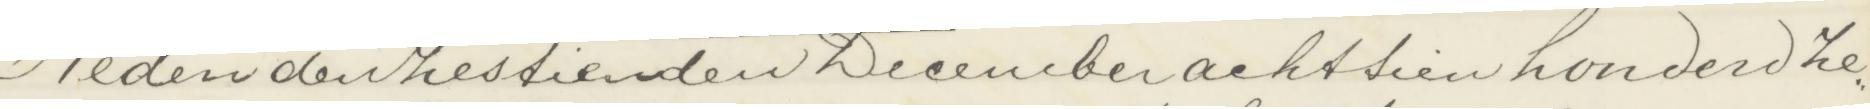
Heden den Zestienden December achttien honderd ze„
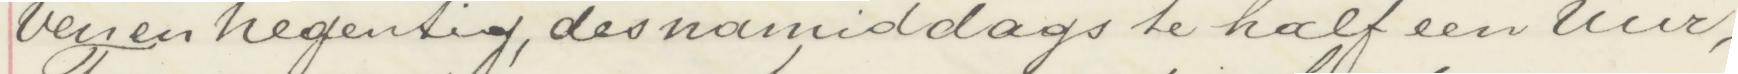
ven en negentig, des namiddags te half een uur,
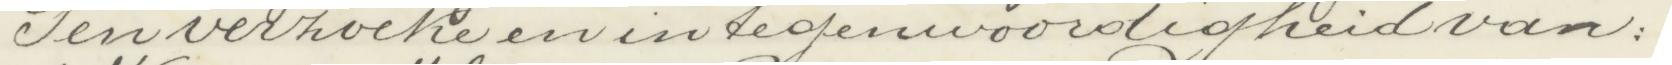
Ten verzoeke en in tegenwoordigheid van:
